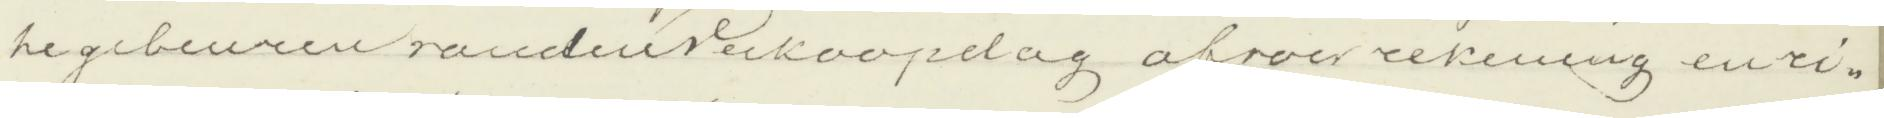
tegebeuren vandenVerkoopdag afvoor rekening en ri„
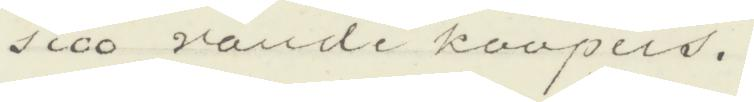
sico van de koopers.
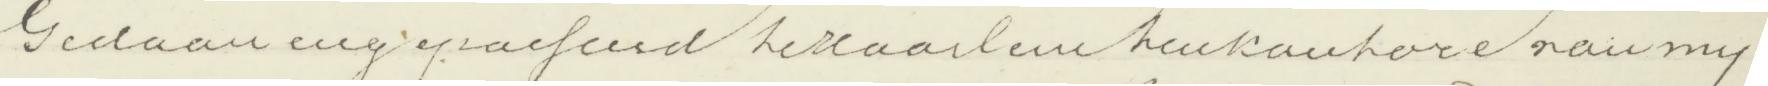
Gedaan engepasseerd teHaarlemtenkantore van my
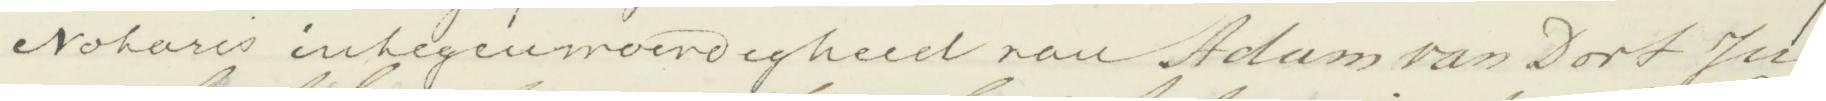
Notaris integenwoordigheid van Adam van Dort Ju
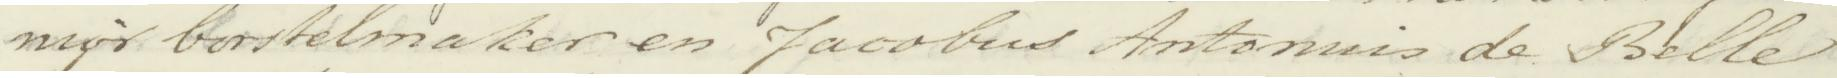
nior borstelmaker en Jacobus Antonius de Belle
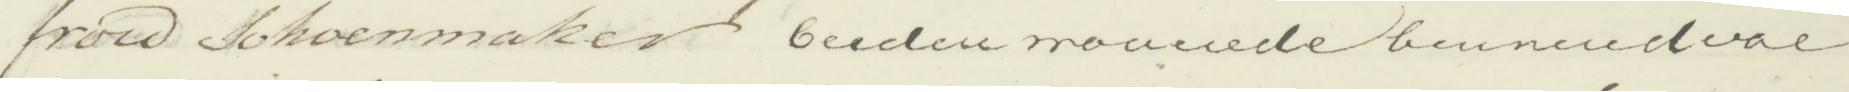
froid schoenmaker beiden wonende binnendeze
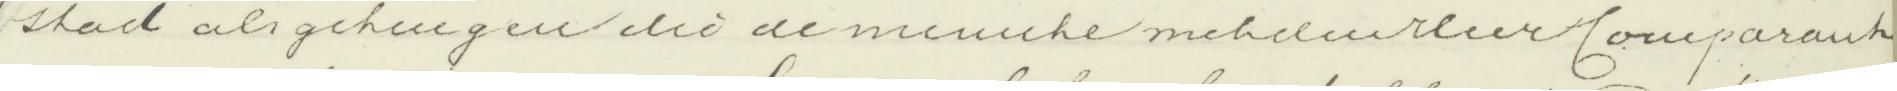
stad als getuigen die de minute metdenHeer Comparant
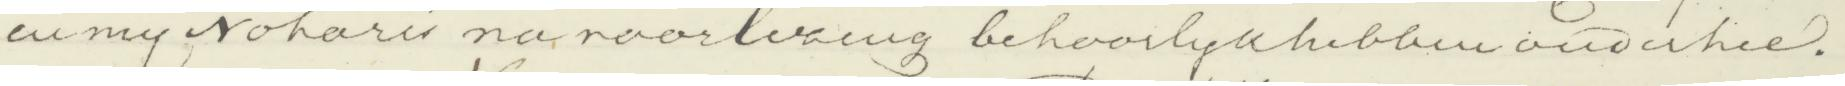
en my Notaris na voorlezing behoorlykhebben ondertee„
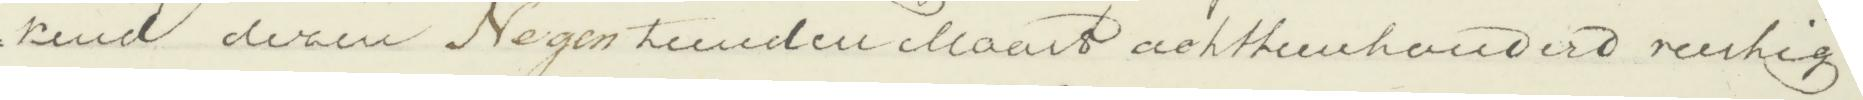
„kend dezen Negentienden Maart achttienhonderd veertig
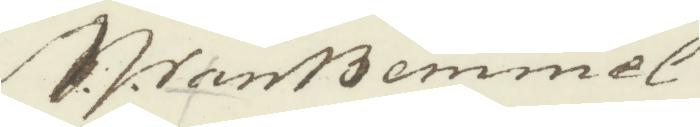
N:J:vanBemmel
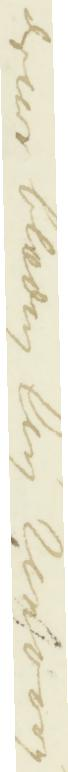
vier bladen Een renvooy
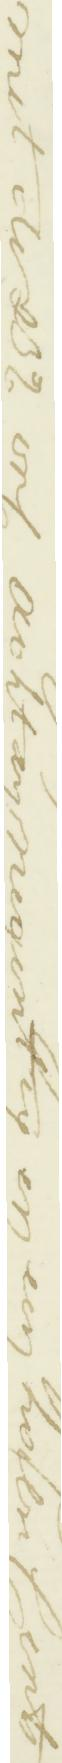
met de 23% onC achtennegentig en een halve Cents
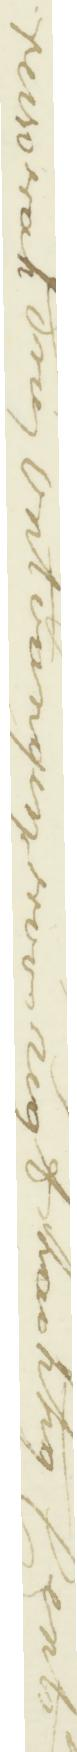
verso vak drie ontvangen voor regt tachtig Cents
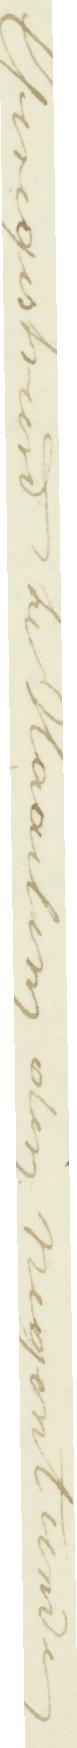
Geregistreerd te Haarlem den negentienden
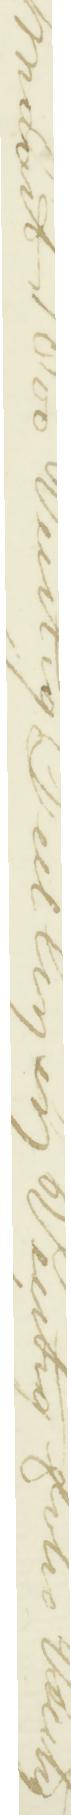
maart 1800 Veertig Deel Een en Veertig folio Veertig
